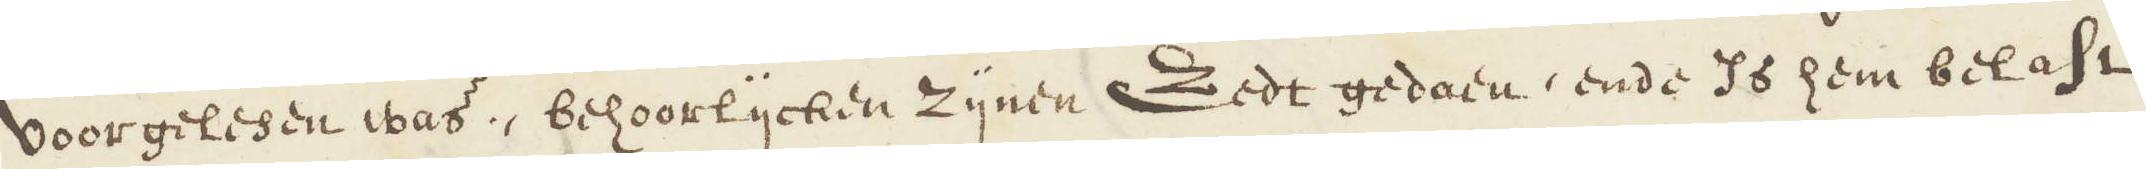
voorgelesen was., behoorlijcken zijnen Eedt gedaen, ende Is hem belast
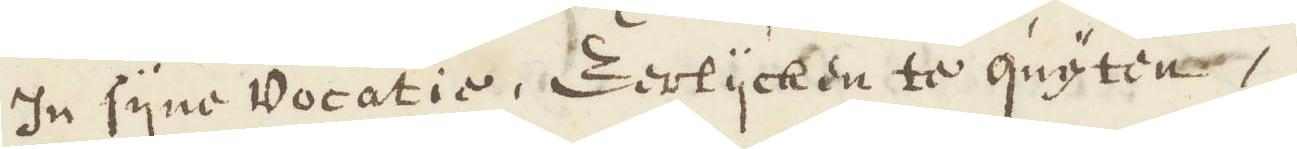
In sijne vocatie, Eerlijcken te quijten /
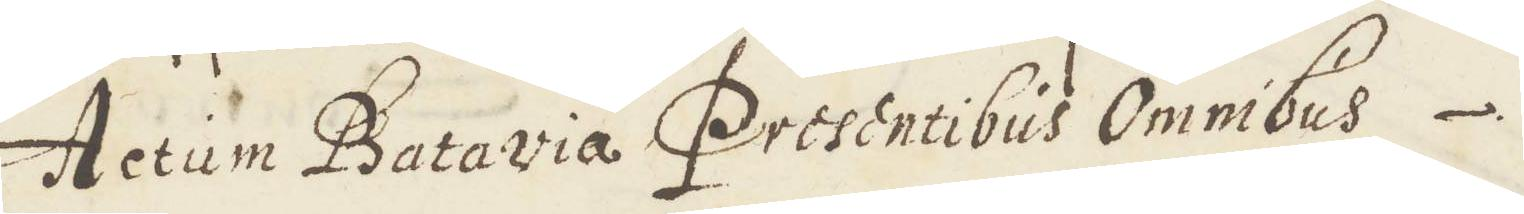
Actum Batavia Presentibus Ommibus —.
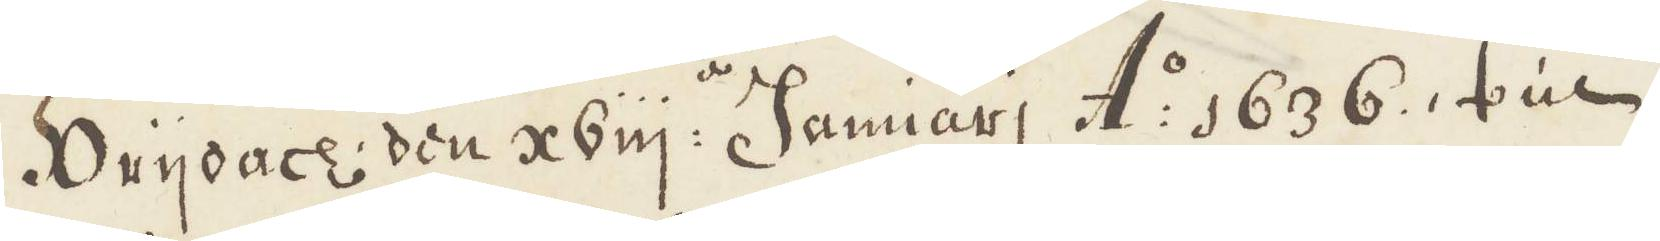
Vrijdach den xviij:e Januarj A:o 1636. , put
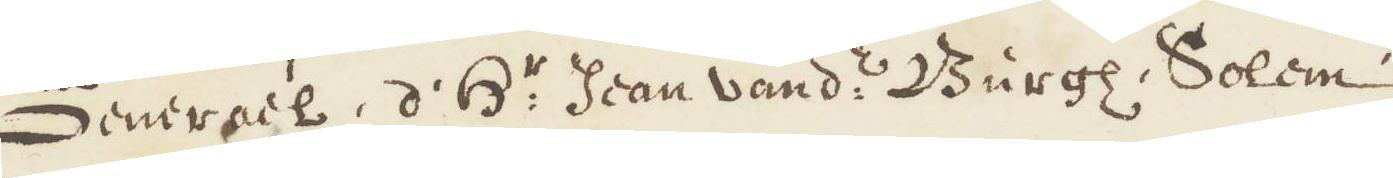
d' Ed: H:r Generael, d’ h:r Iean van d:r Burgh, solem
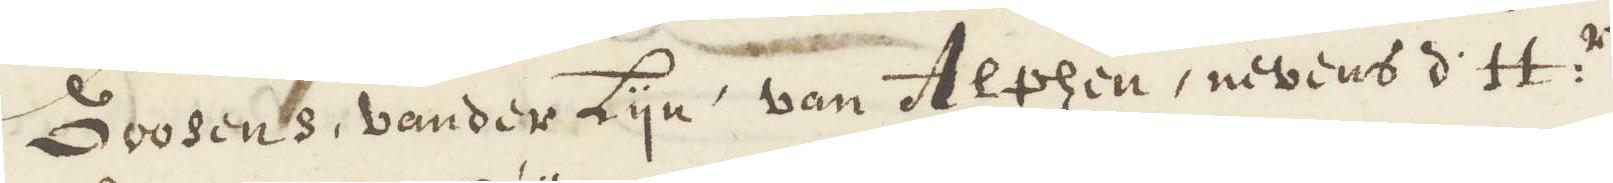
Goosens, van der Lijn, van Alphen, nevens d’ H:r
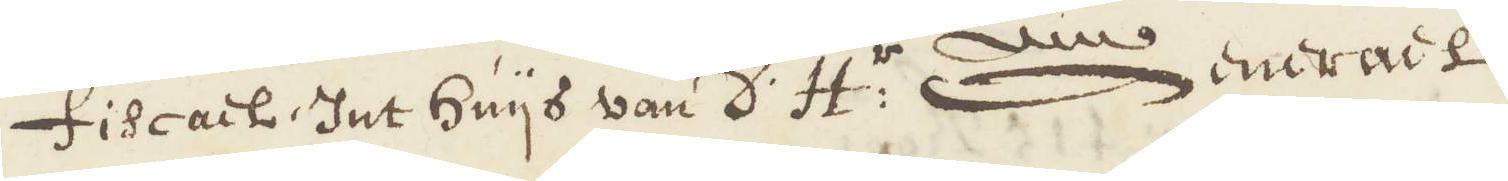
fiscael, Int huijs van d' H:r Generael
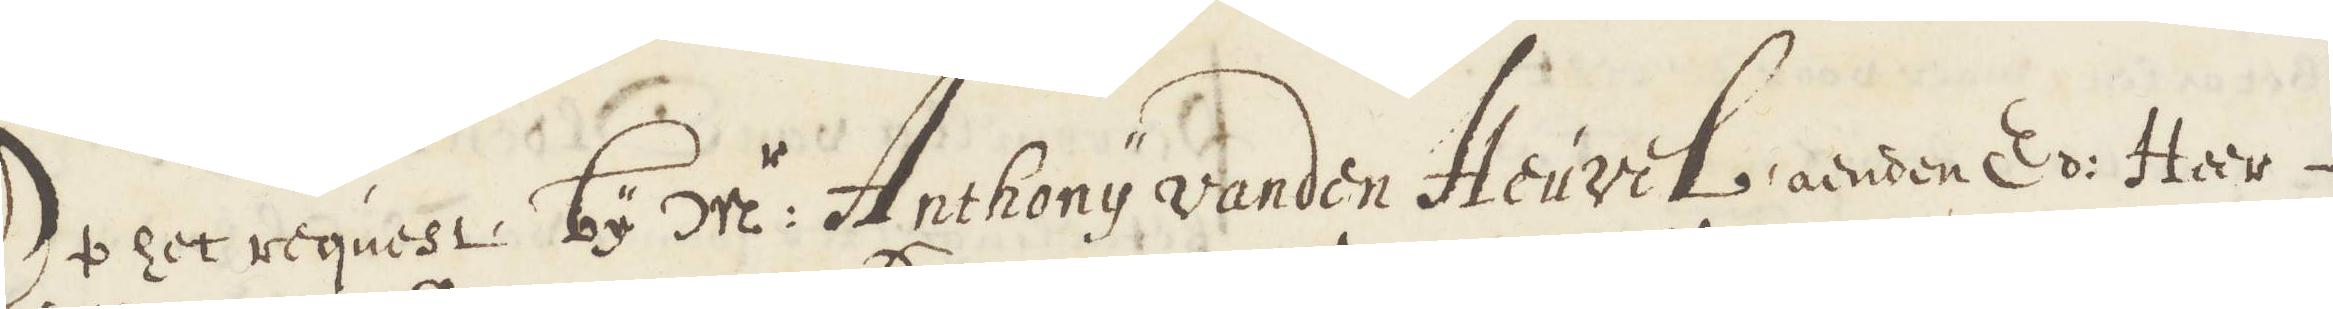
Op het request; bij M:r Anthonio van den Heuvel, aenden Ed: Heer
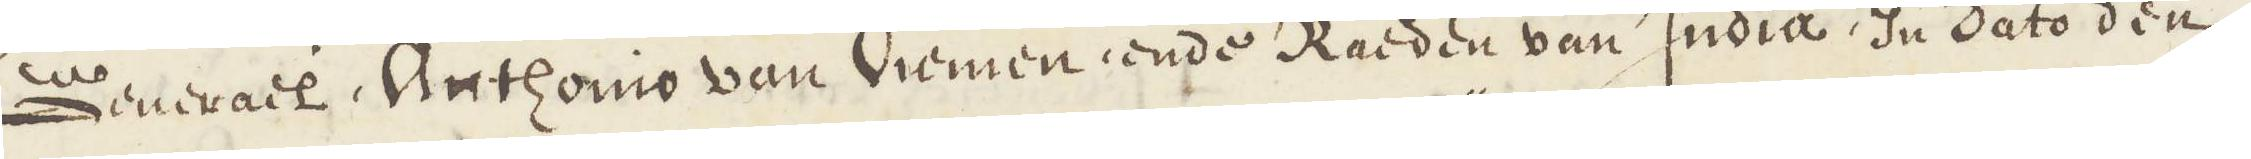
Generael, Anthonio van Diemen, ende Raeden van Jndia, In dato den
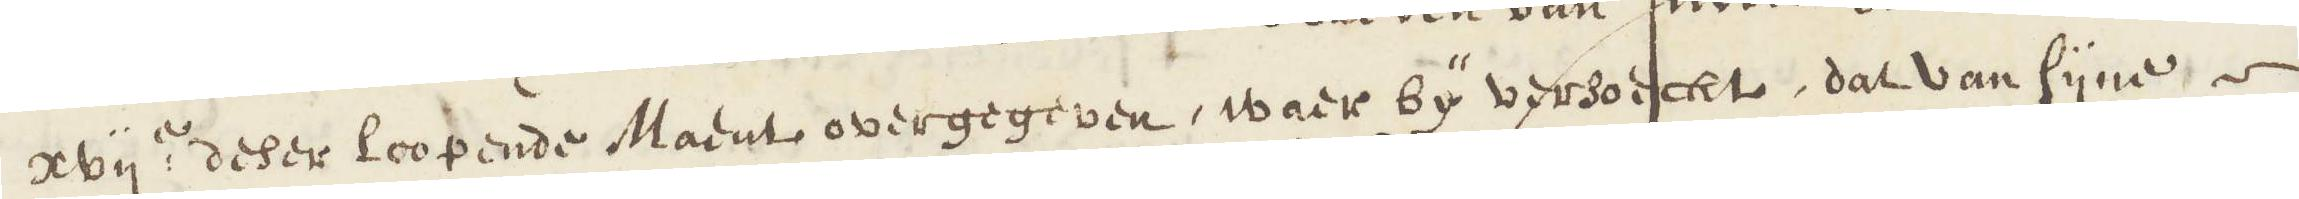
xvij:e deser loopende Maent overgegeven, waer bij versoeckt, dat van sijne
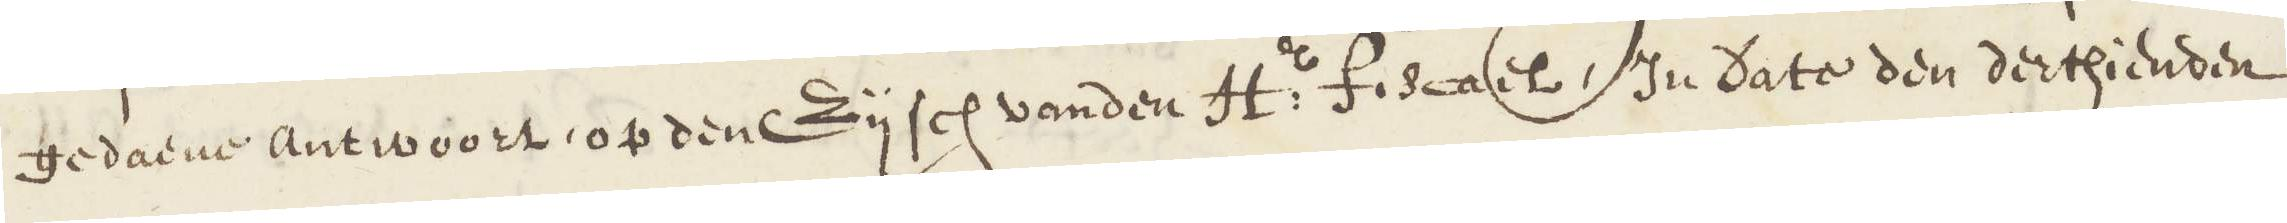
gedaene antwoort, op den Eijsch van den H:r fiscael, In dato den derthienden
